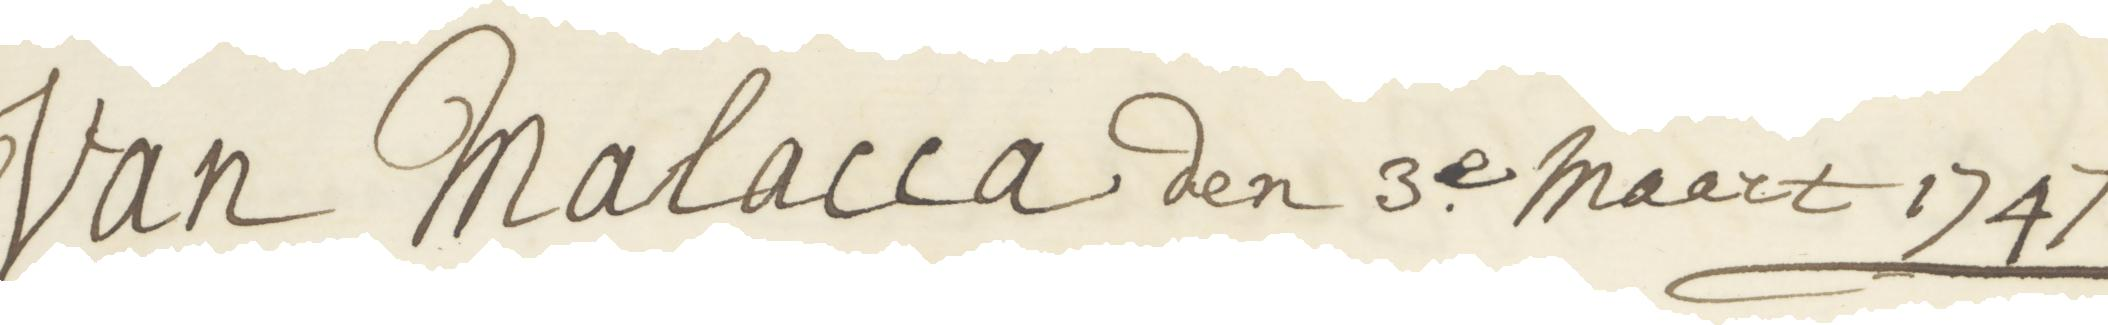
Van Malacca den 3.e maart 1747.
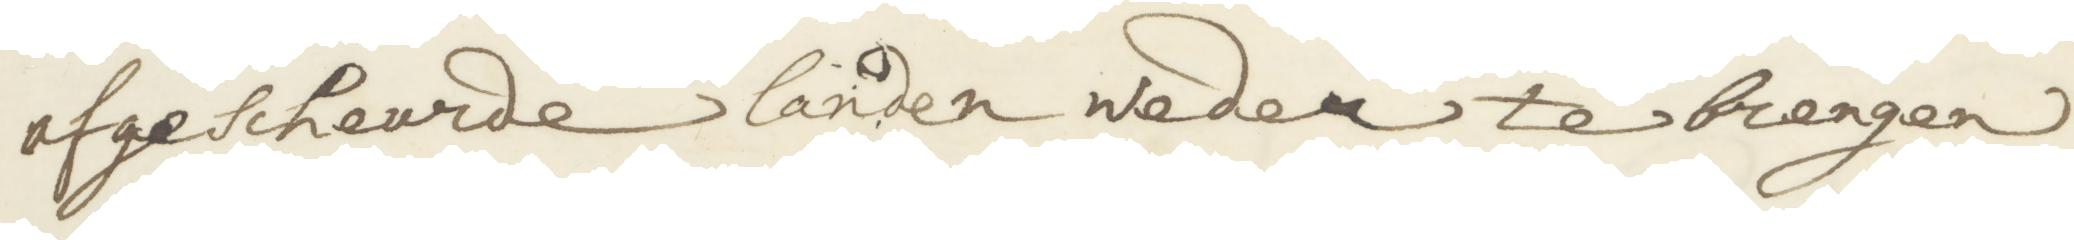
afgescheurde landen weder te brengen
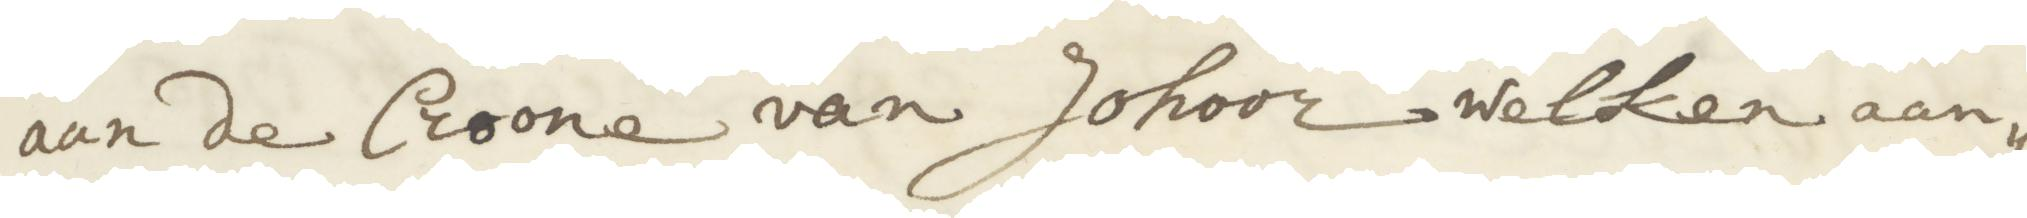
aan de Croone van Johoor welker aan„
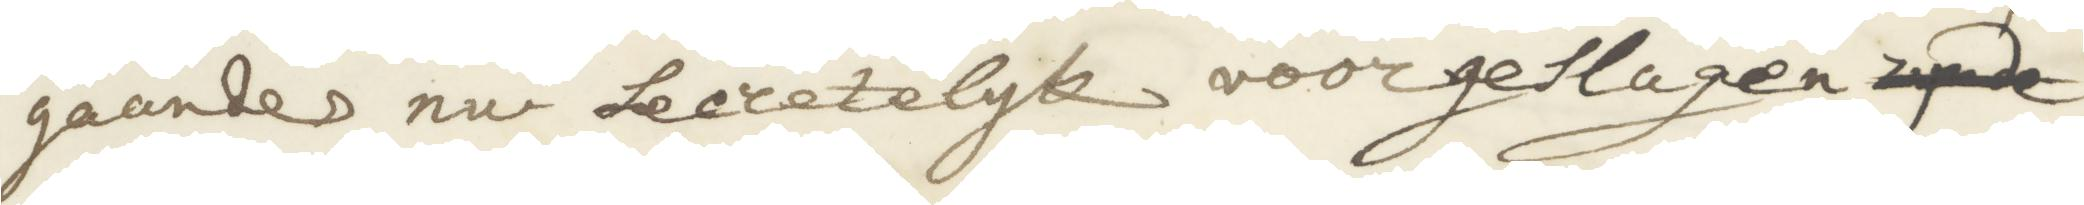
gaande nu secretelijk voorgeslagen zynde
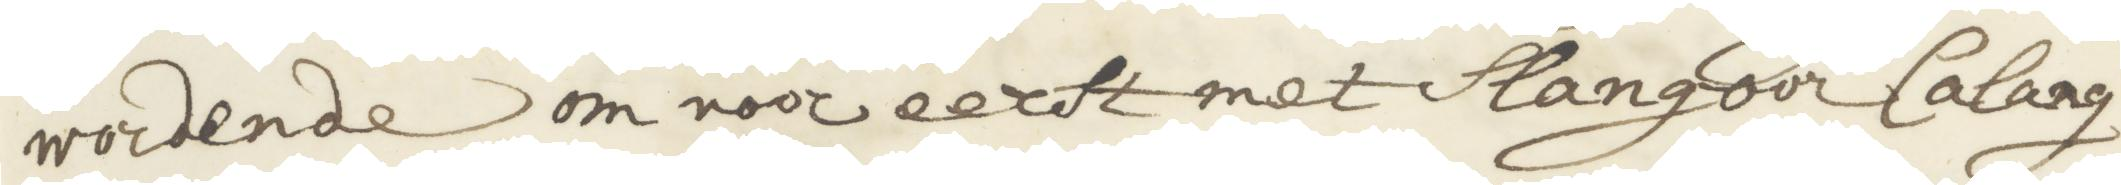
wordende om voor eerst met slangoor Calang
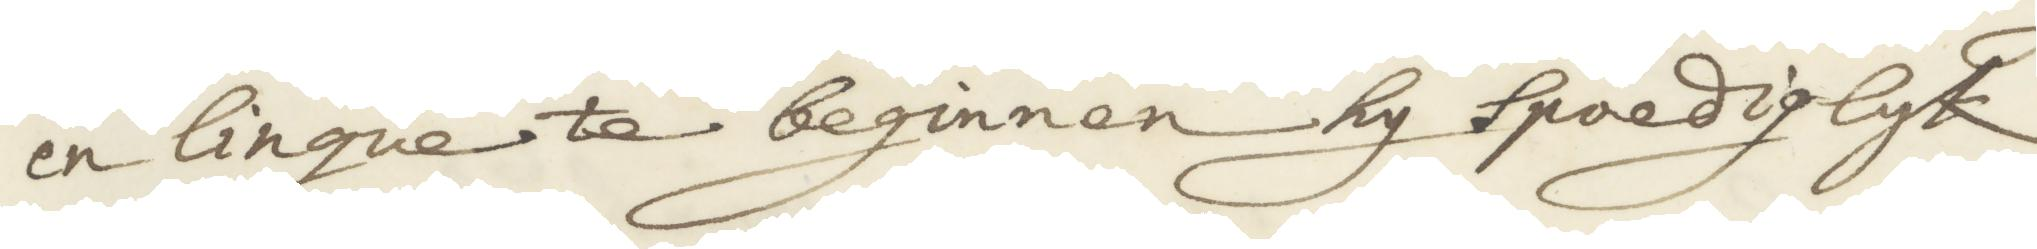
en lingie te beginnen hy spoediglyk
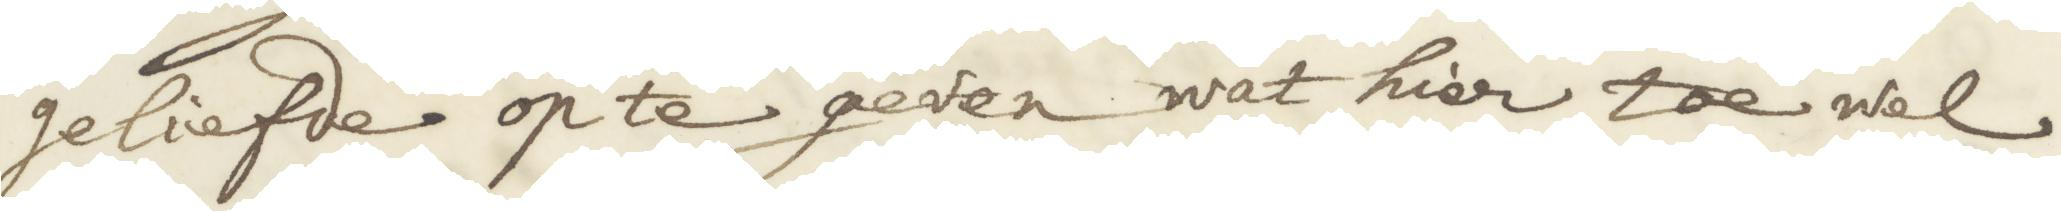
geliefde op te geven wat hier toe wel
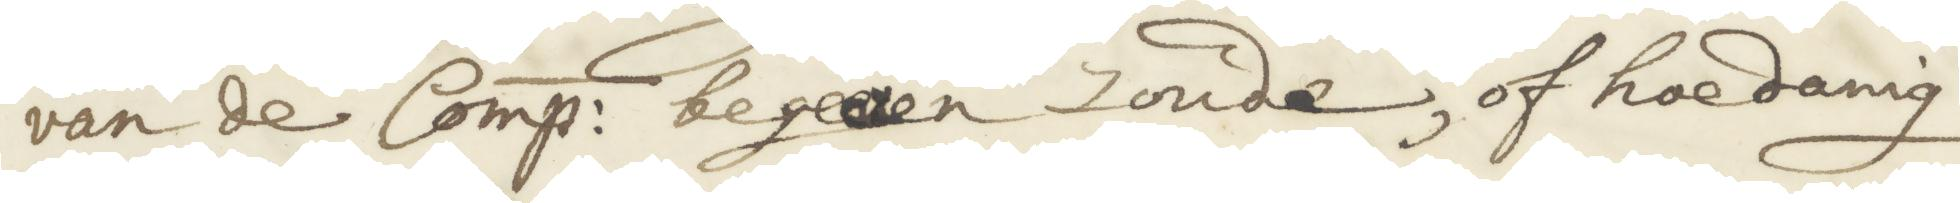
van de Comp: begeven zoude, of hoedanig
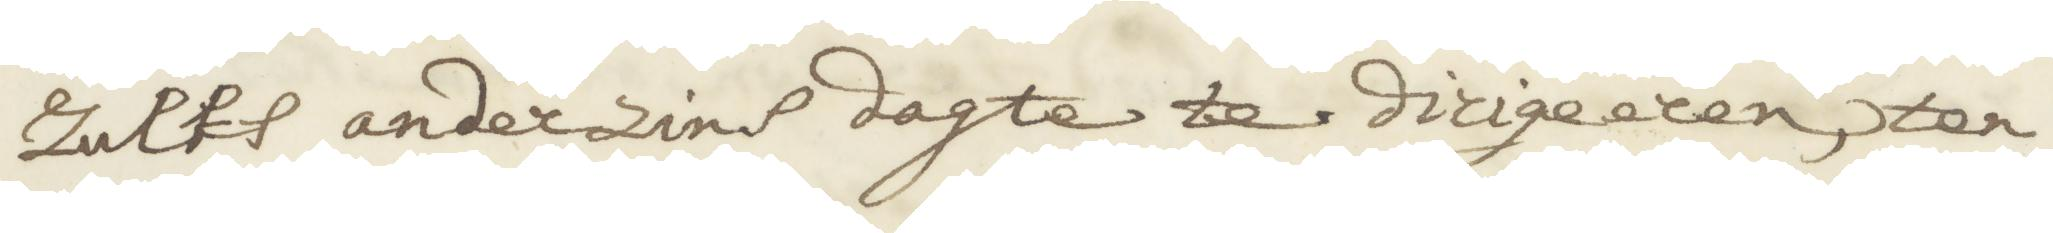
zulks anderzins dagte te dirigeeren, ter
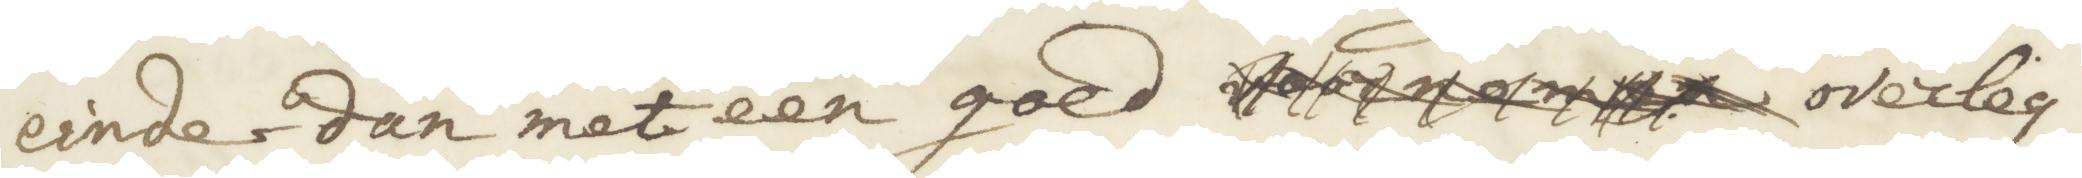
einde dan met een goed voornemen overleg
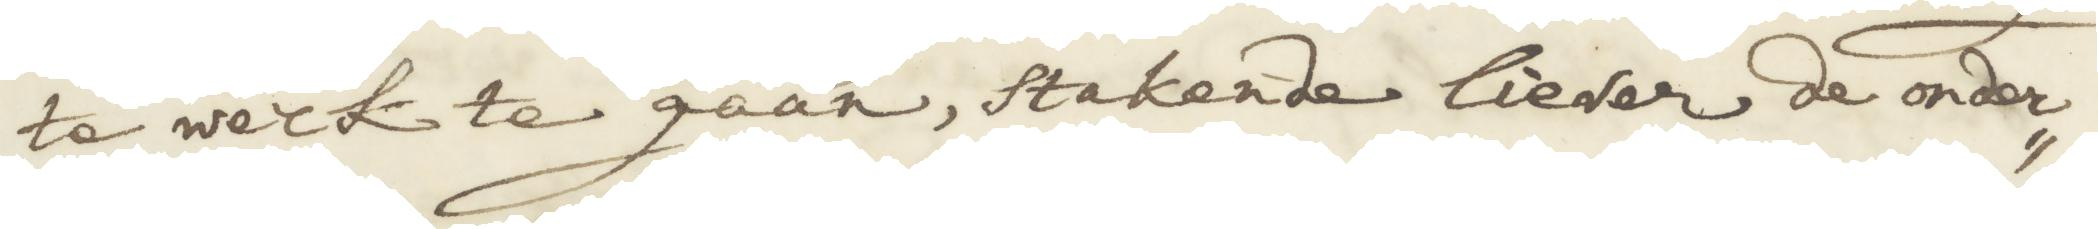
te werk te gaan, stakende liever de onder„
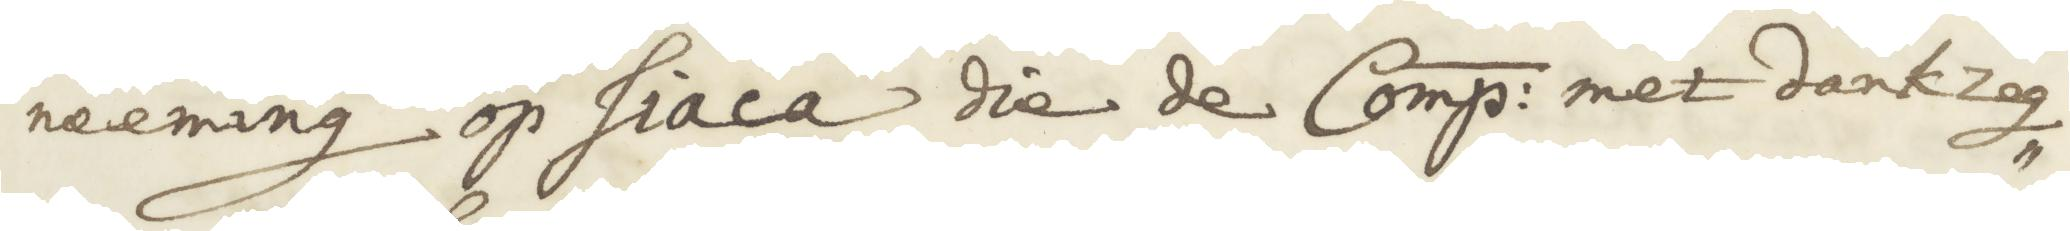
neeming op siaca die de Comp: met dankzeg„
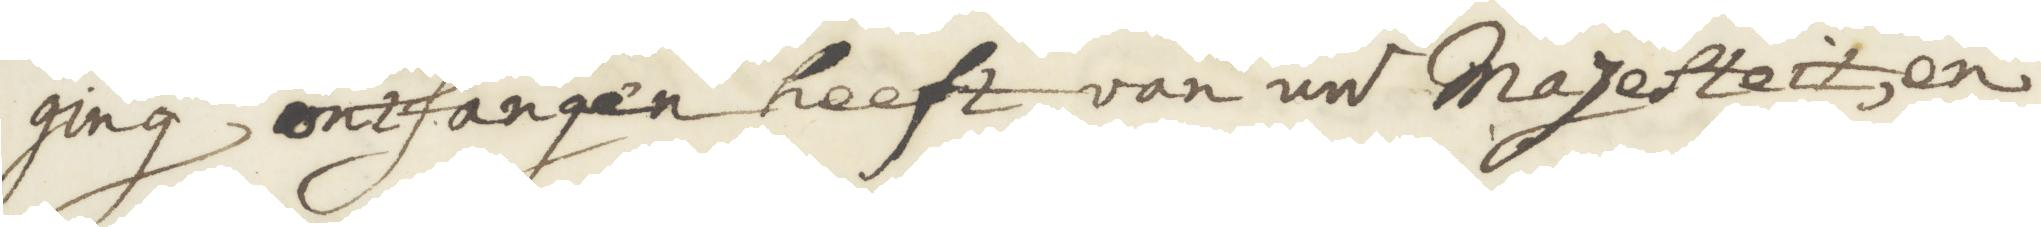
ging ontfangen heeft van uw Majesteit, en
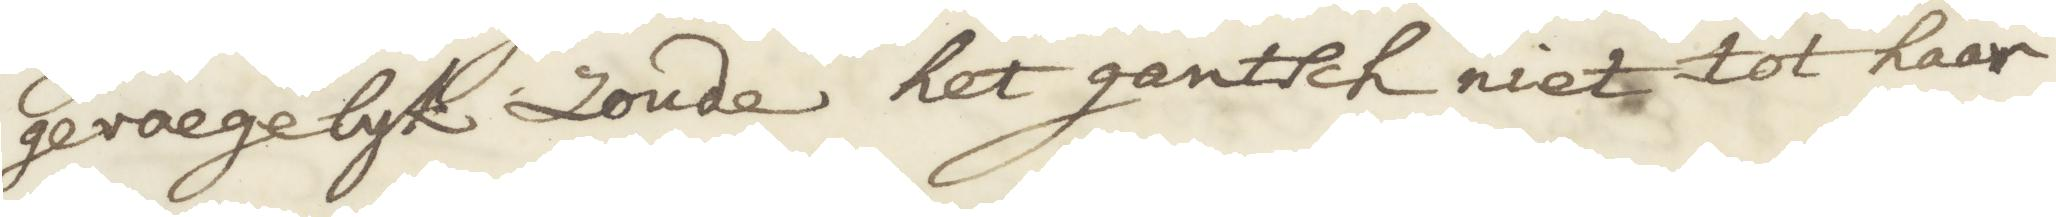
gevoegelyk zoude het gantsch niet tot haar
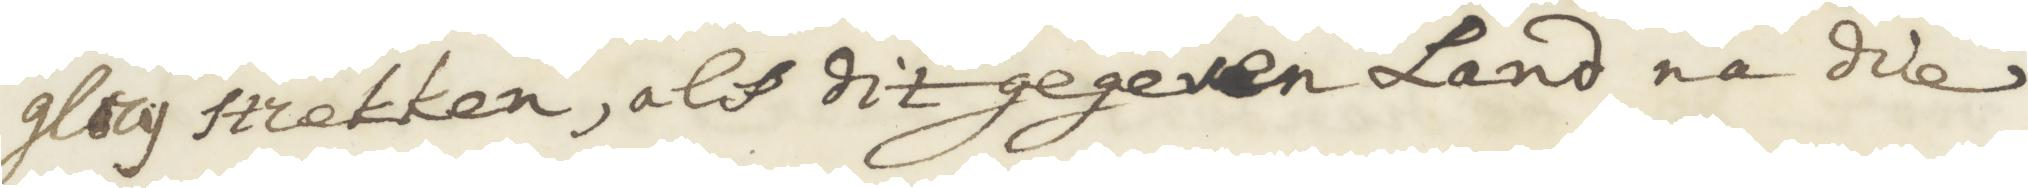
glory strekken, als dit gegeven land na die
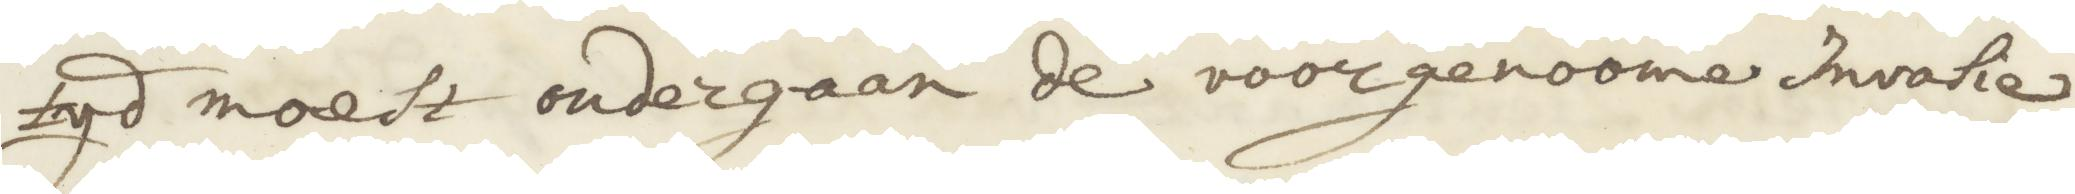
tyd moest ondergaan de voorgenoome jnvasie
